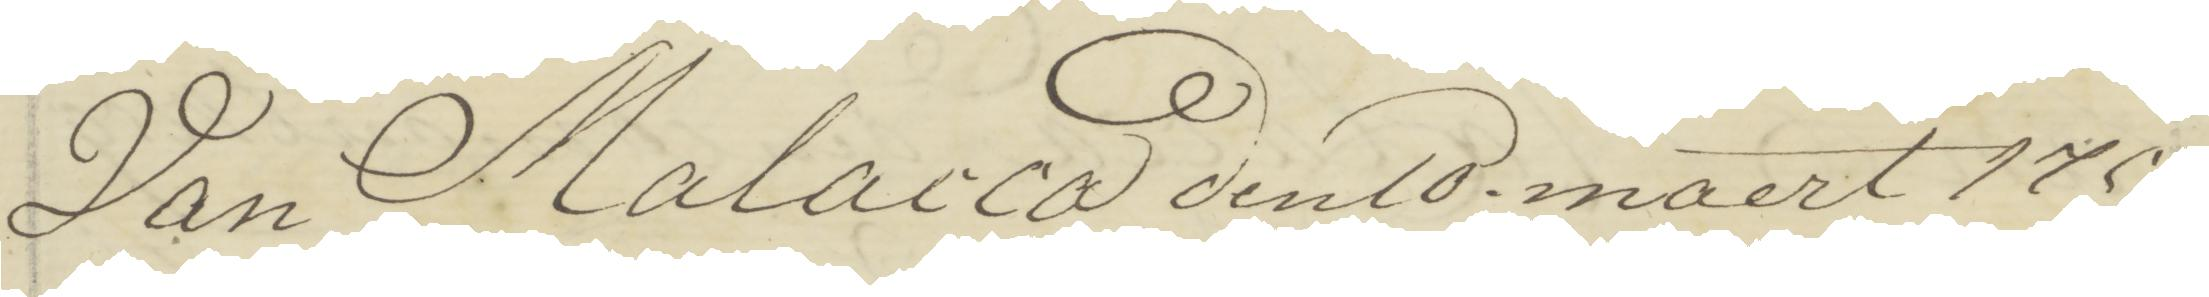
Van Malacca den 10. maert 1759
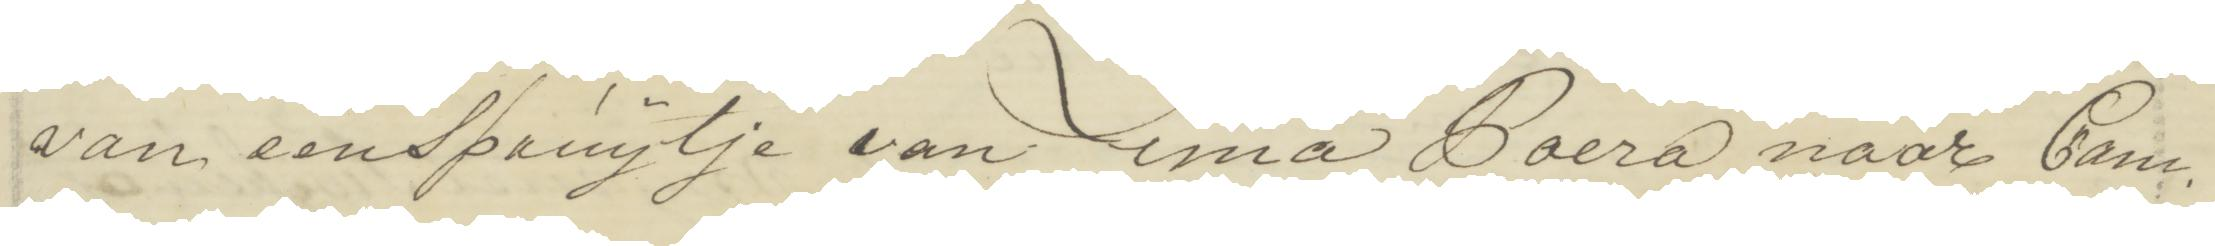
van een spruijtje van Lima Poera naar Cam„
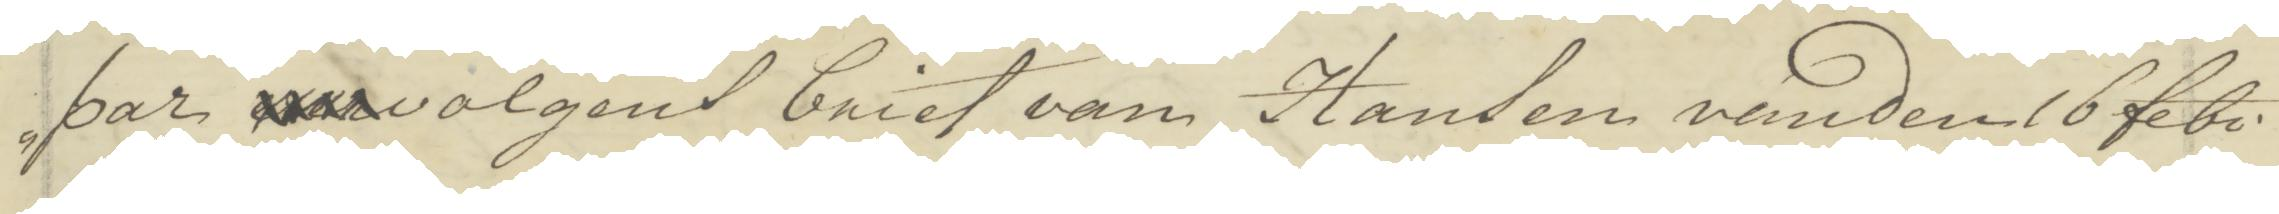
par nae volgens brief van Hansen vanden 16 febr.
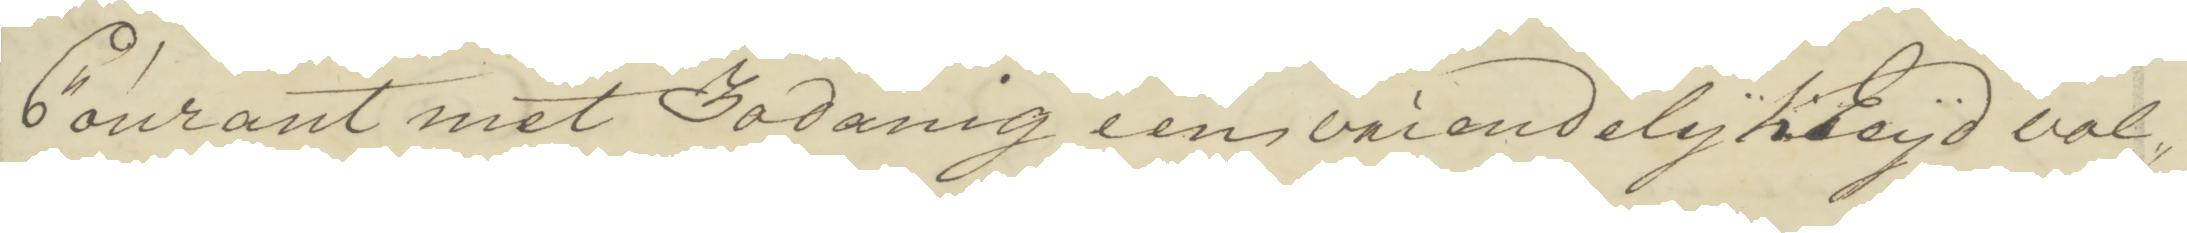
Courant met zodanig een vriendelijkheijd vol„
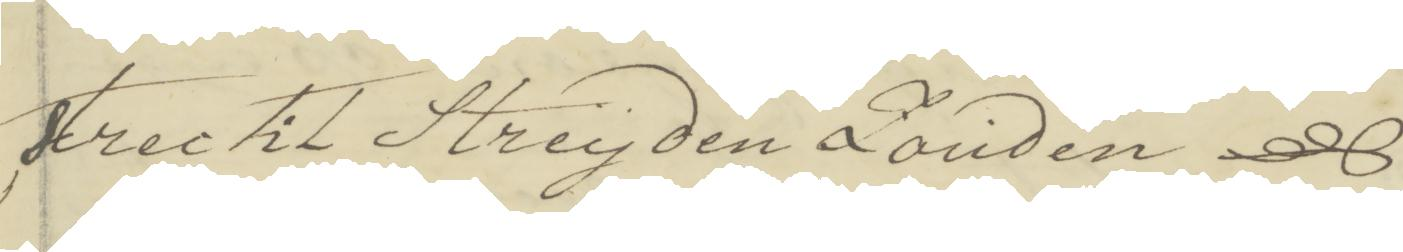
„streckt streijden zouden
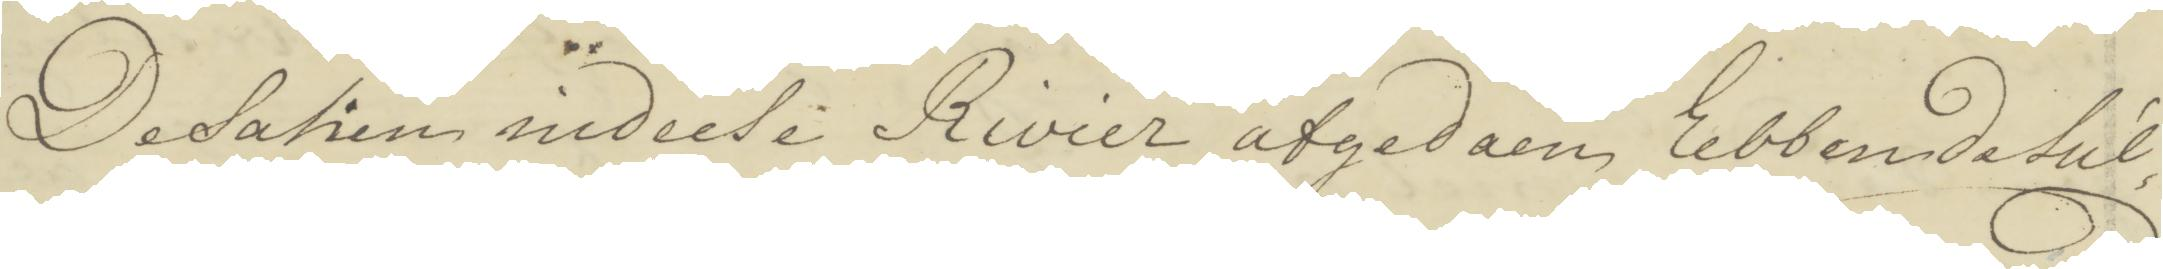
De saken in deese Rivier afgedaen hebbende sul„
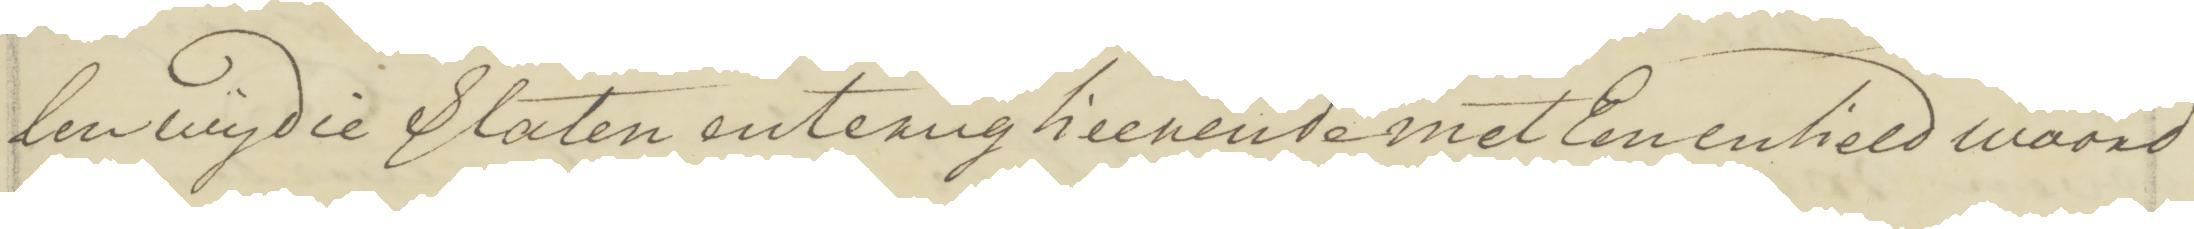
len wij die verlaten en terug keerende met Een enkeld woord
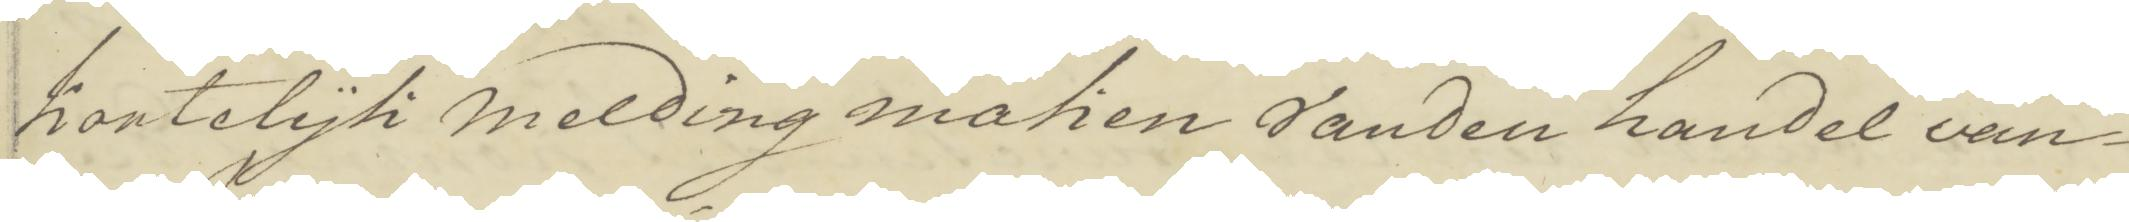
kortelijk melding maken vanden handel van
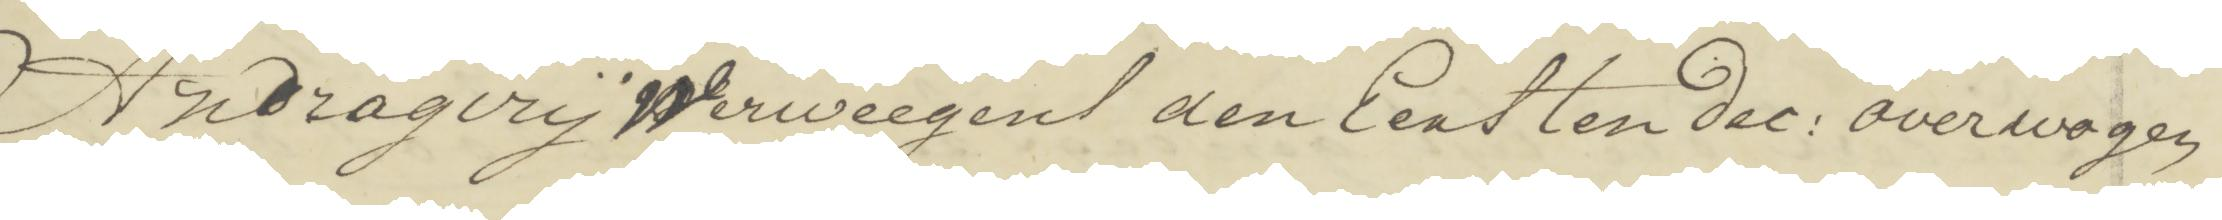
Andragirij werweegens den Eersten dec: overwogen
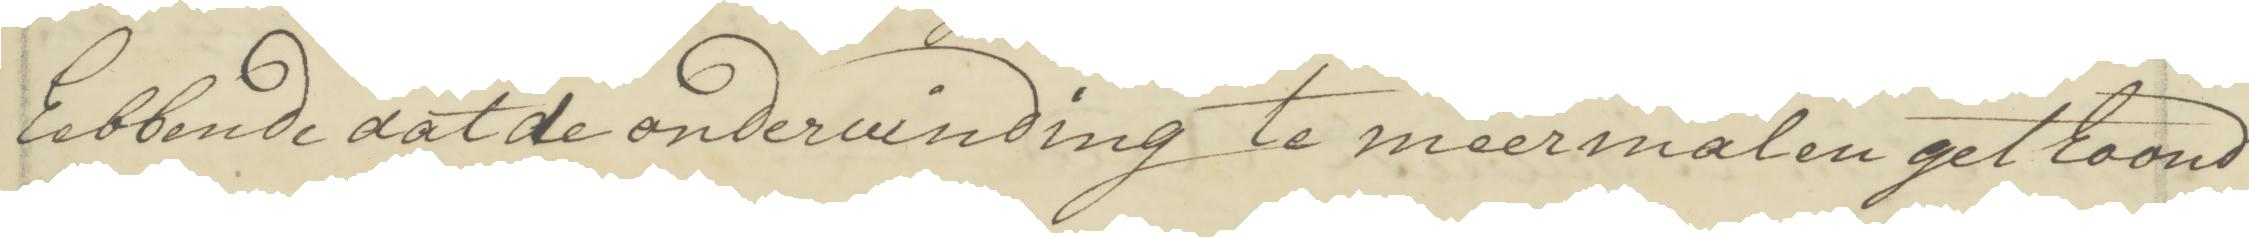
hebbende dat de ondervinding te meermalen gethoond
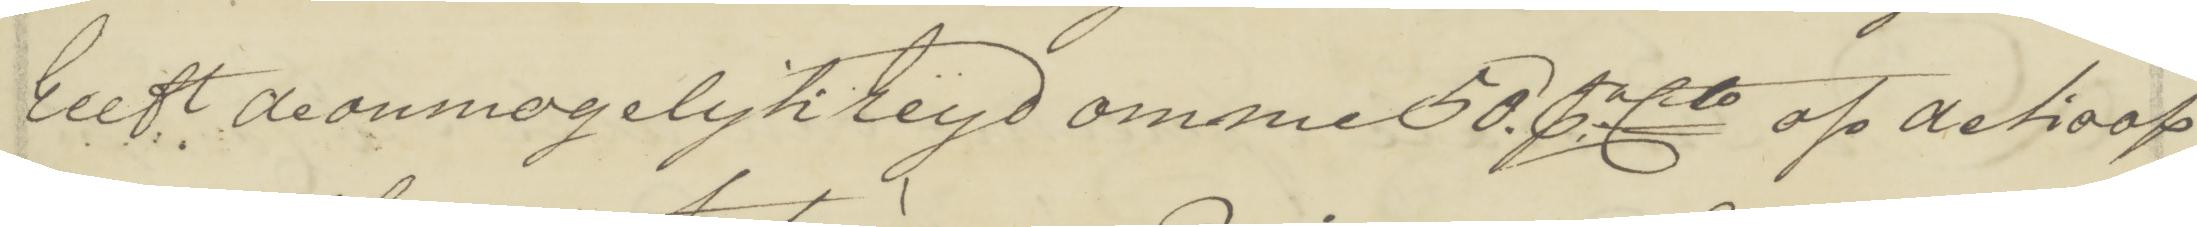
heeft de onmogelijkheijd omme 50. p.r C=to op de koop
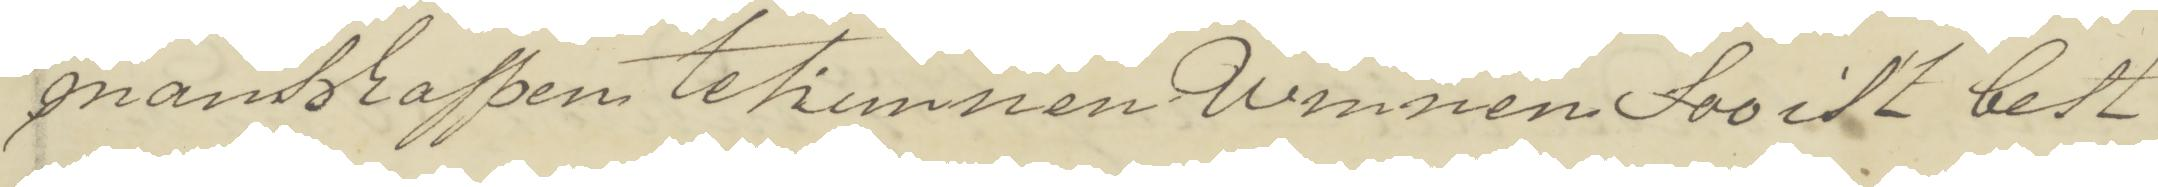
manschappen te kunnen winnen soo is't best
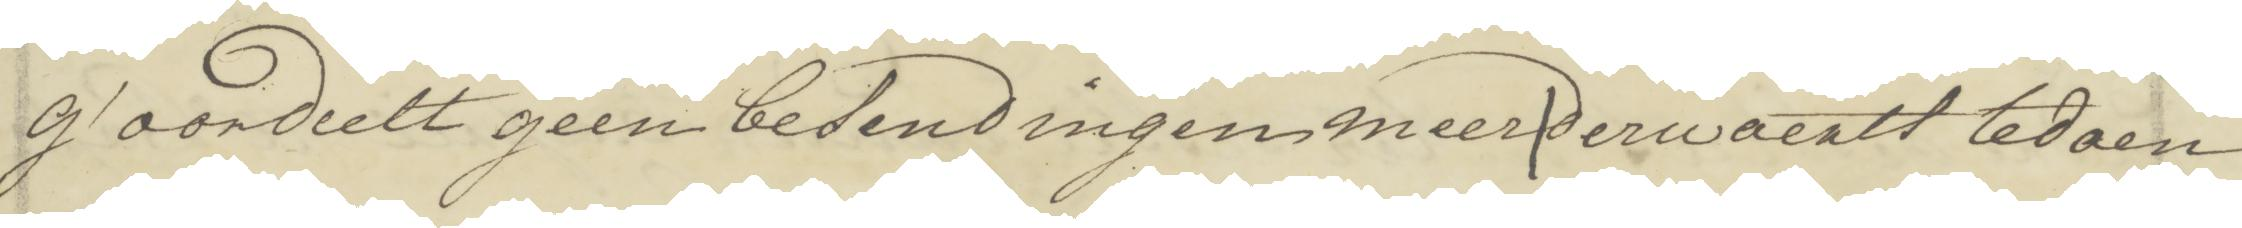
g’oordeelt geen besendingen meer derwaerts te doen
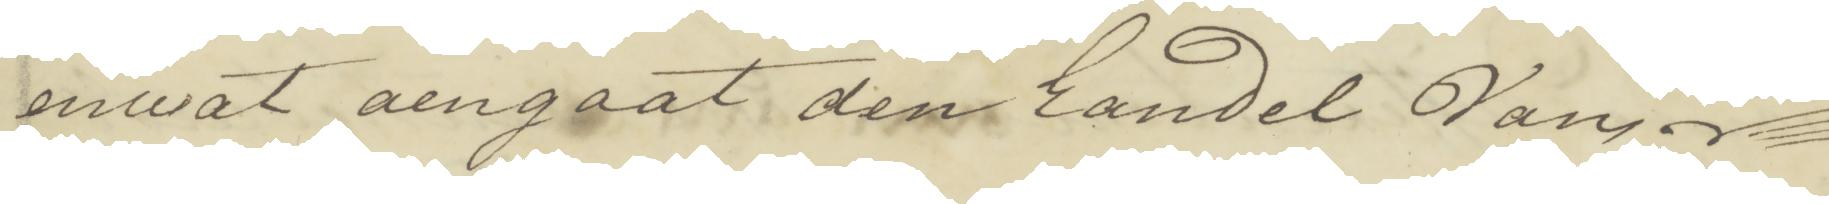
en wat aengaat den handel van
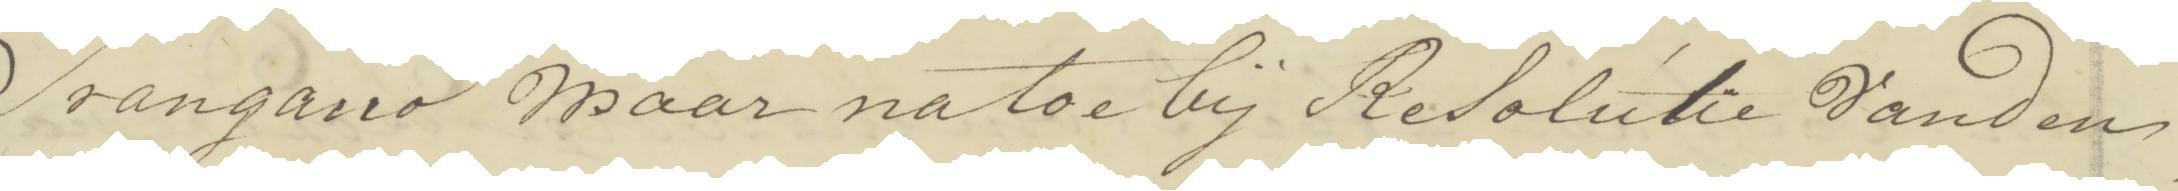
Trangano waar na toe bij Resolutie van den
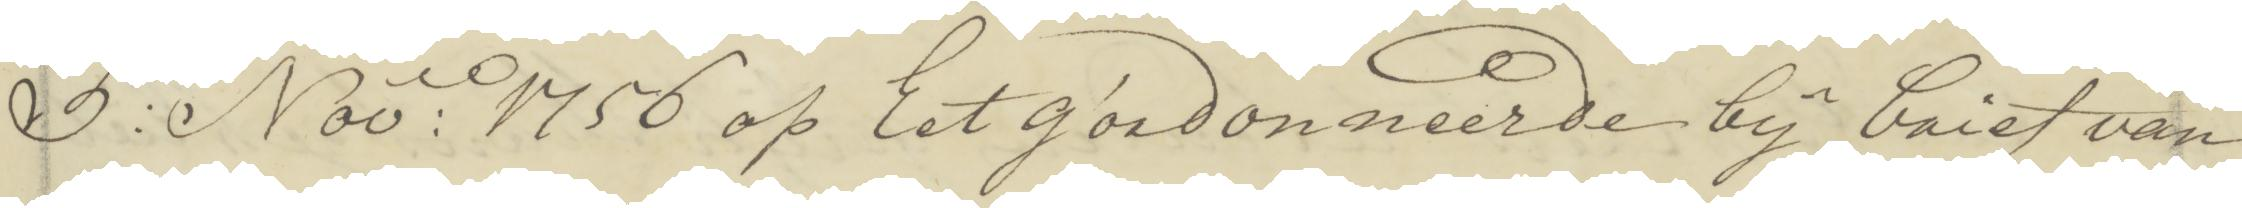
5: Nov:r 1756 op het g'ordonneerde bij brief van
